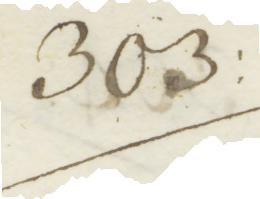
303:
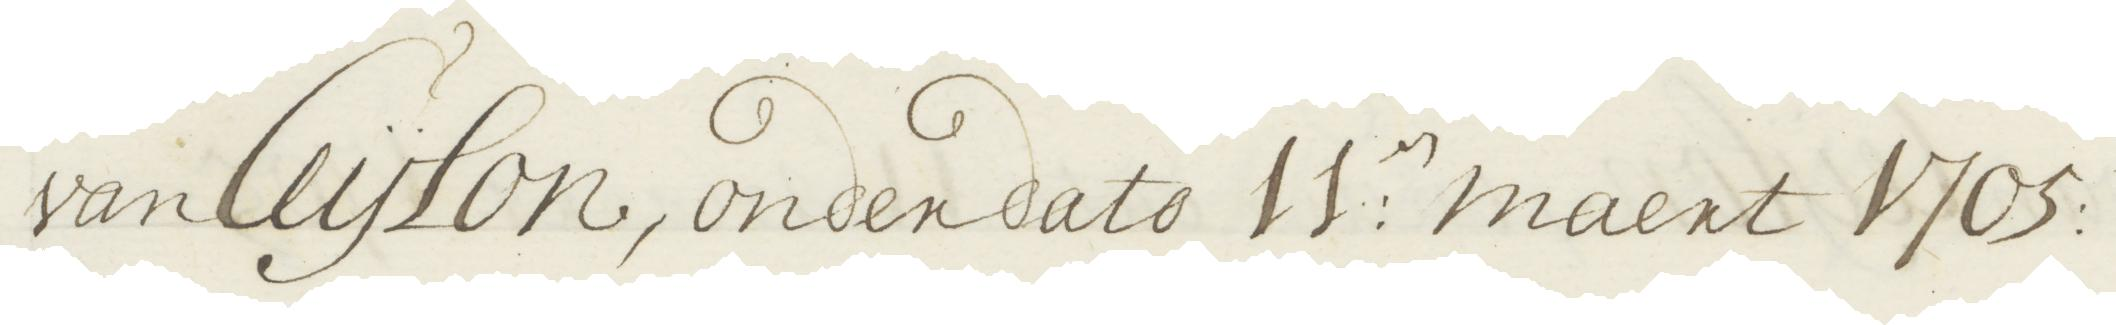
van Ceijlon, onder dato 11:en maert 1705:
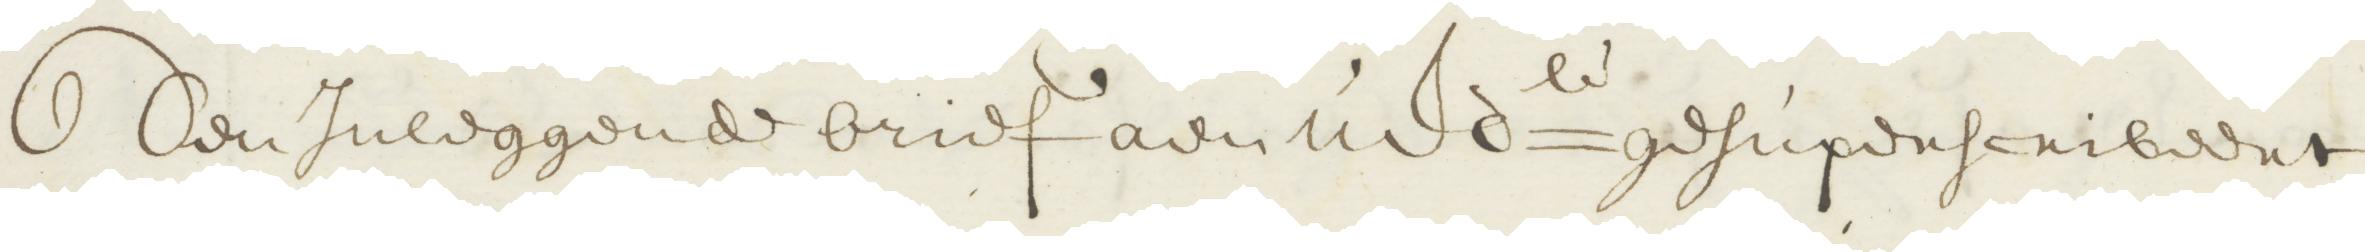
Den Jnleggende brief aen uEd=e gesuperscribeert
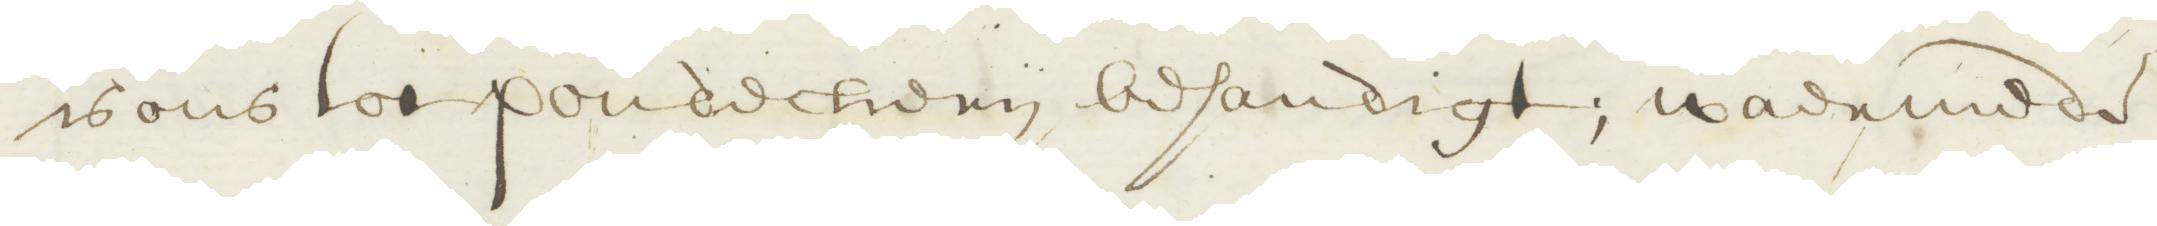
is ons tot poudeckerij behandigt; waermede
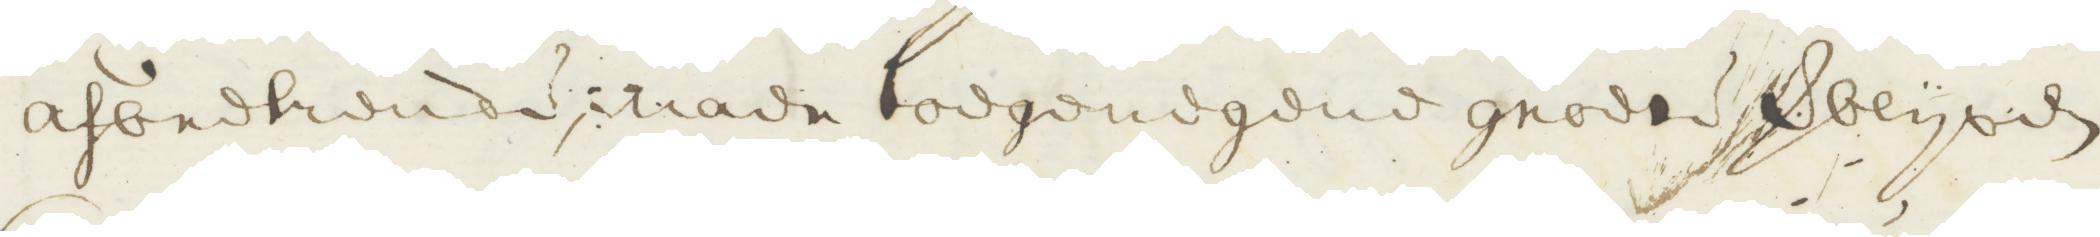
afbrekende, naer toegenegene groete verblijven
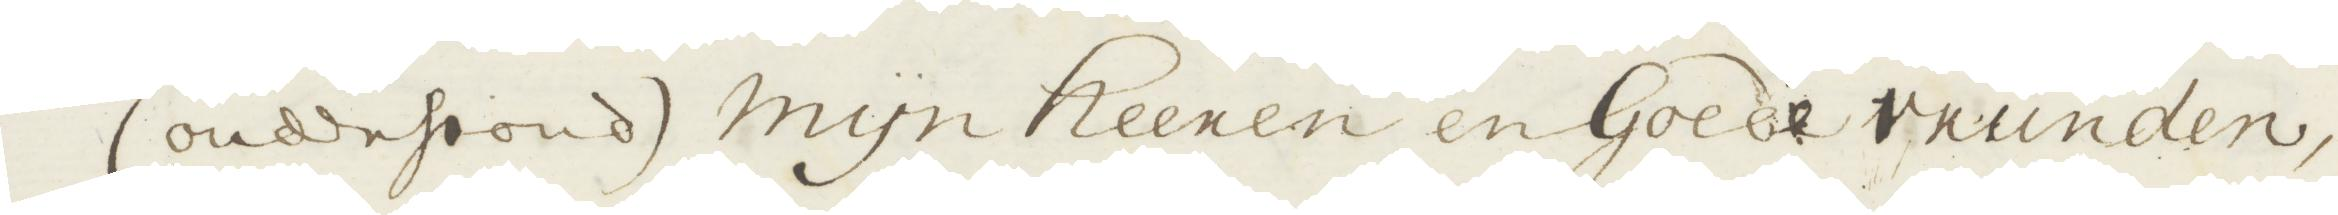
(onderstond) mijn Heeren en Goede vrunden,
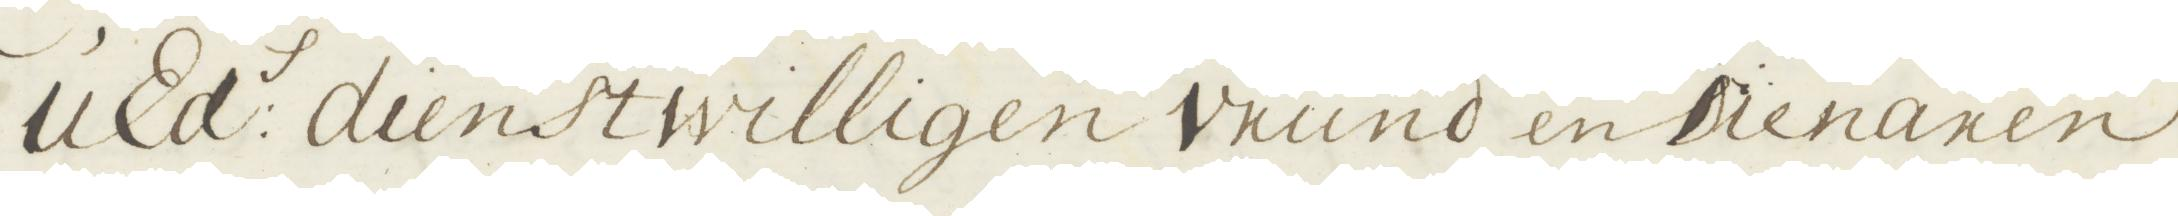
uEd:e dienstwilligen vrund en Dienaren
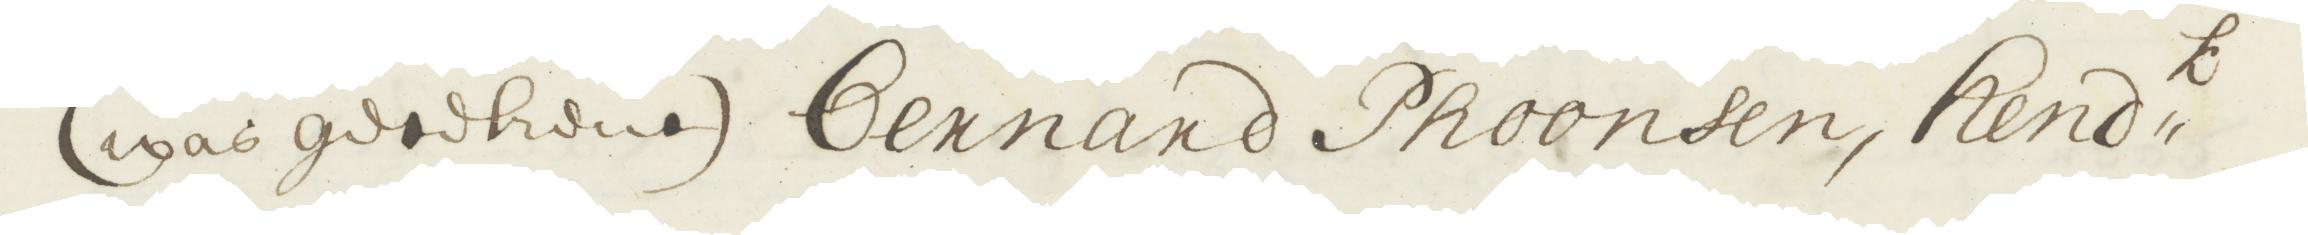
(was getekent) Bernard Phoonsen, hend„k
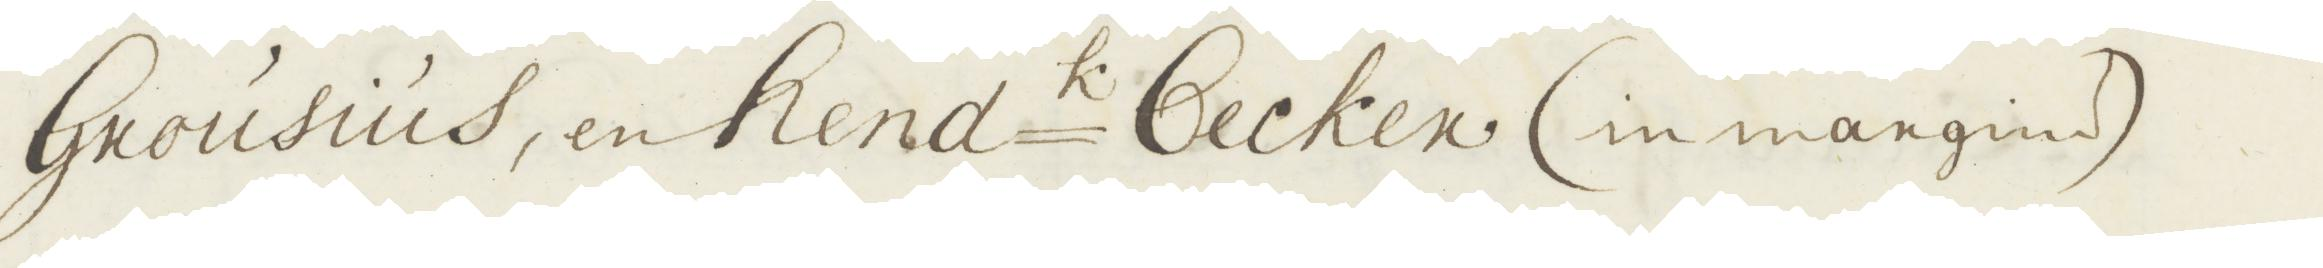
Grousius, en hend=k becker (in margine)
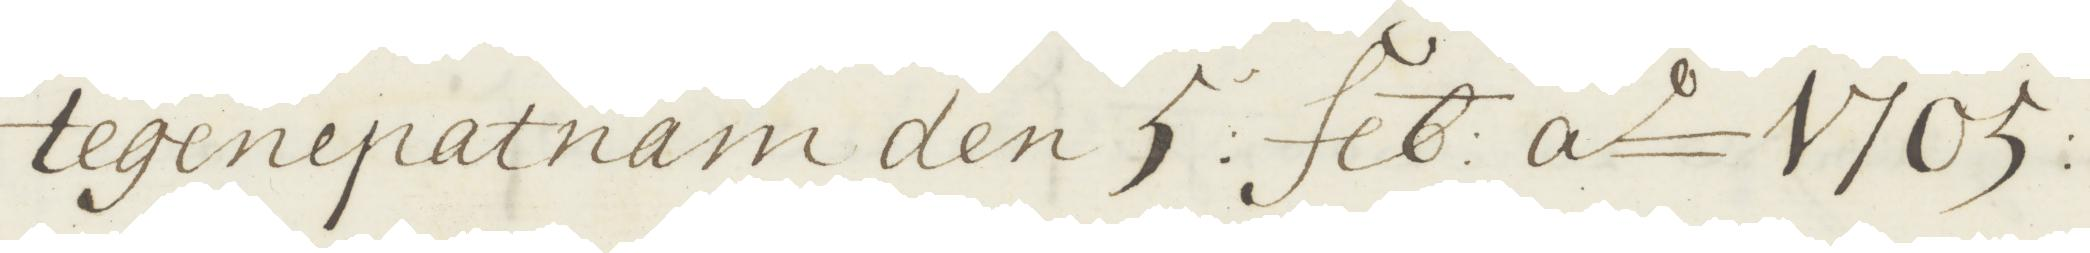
tegenepatnam den 5:' feb: a=o 1705:
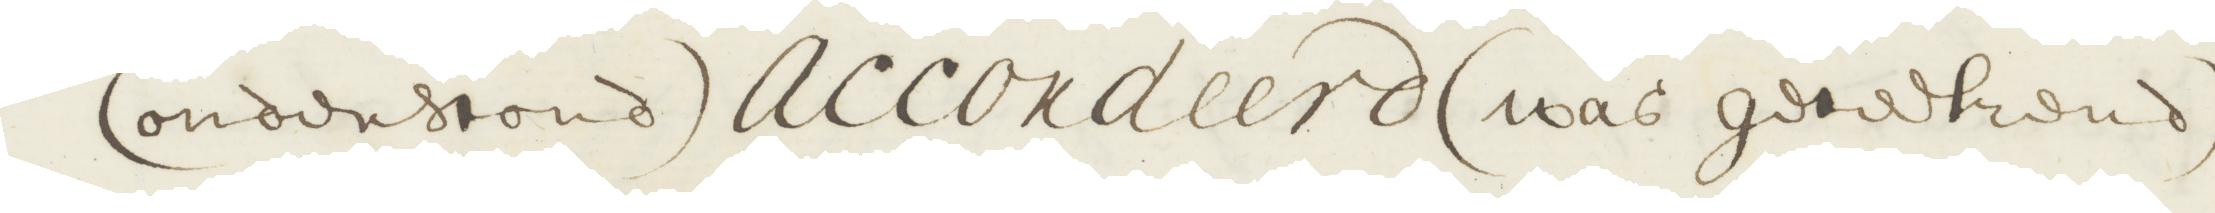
(onderstond) Accordeerd (was geteekend)
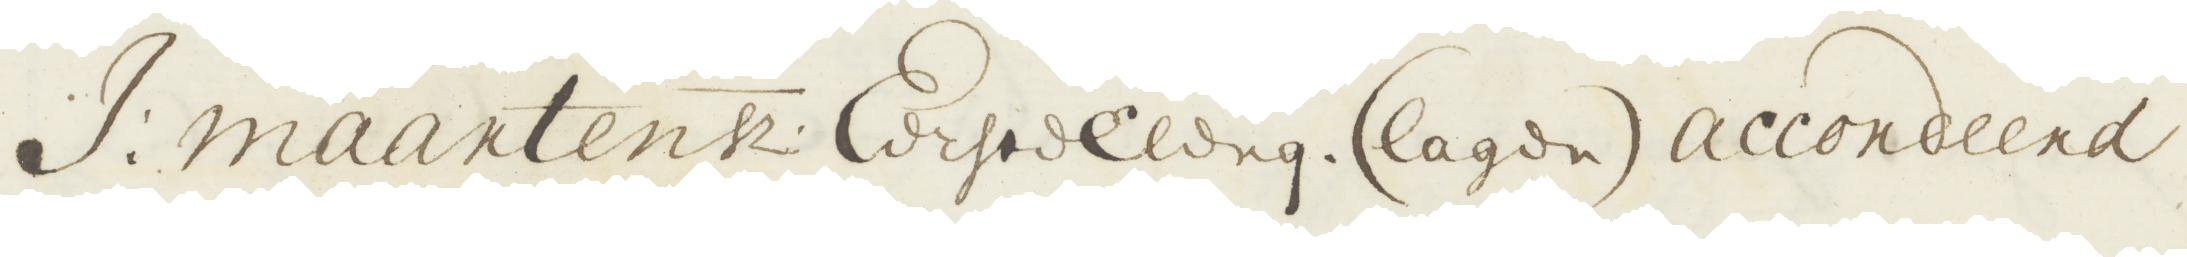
I: maartensz: Eersteclerq. (lager) accordeerd
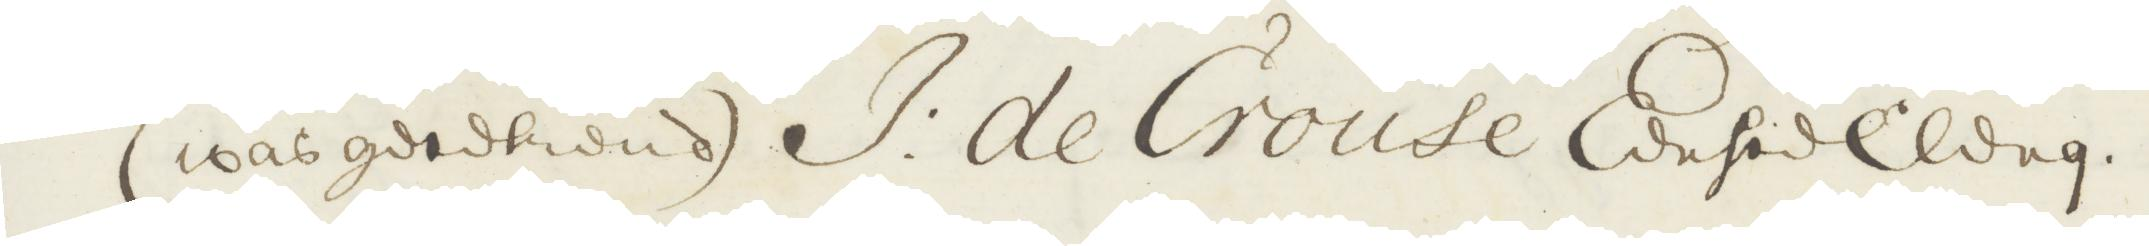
(was getekend) J: de Crouse Eersteclerq.
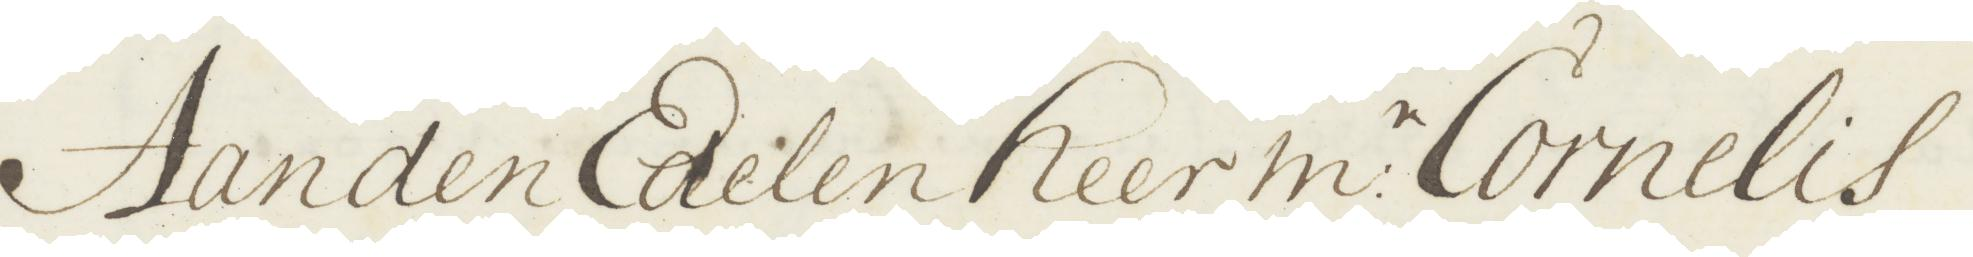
Aan den Edelen Heer m:r Cornelis
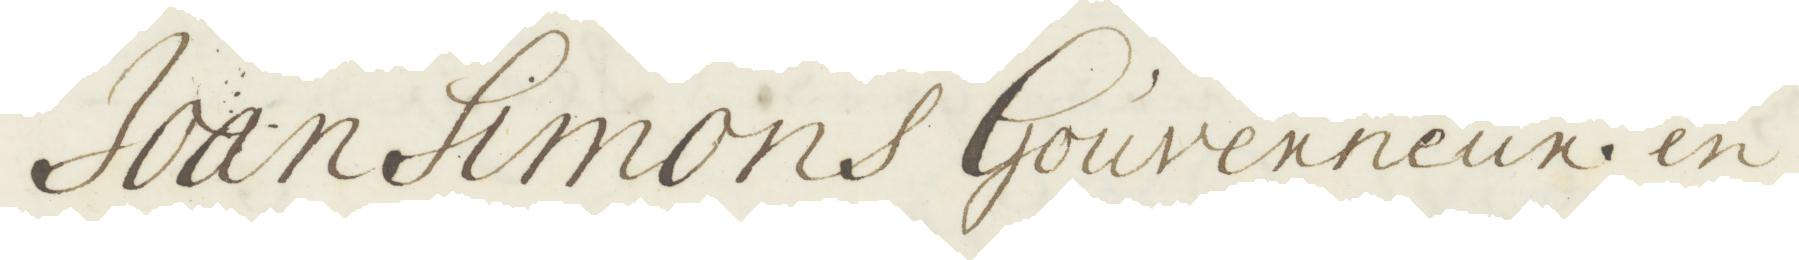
Joan Simons Gouverneur en
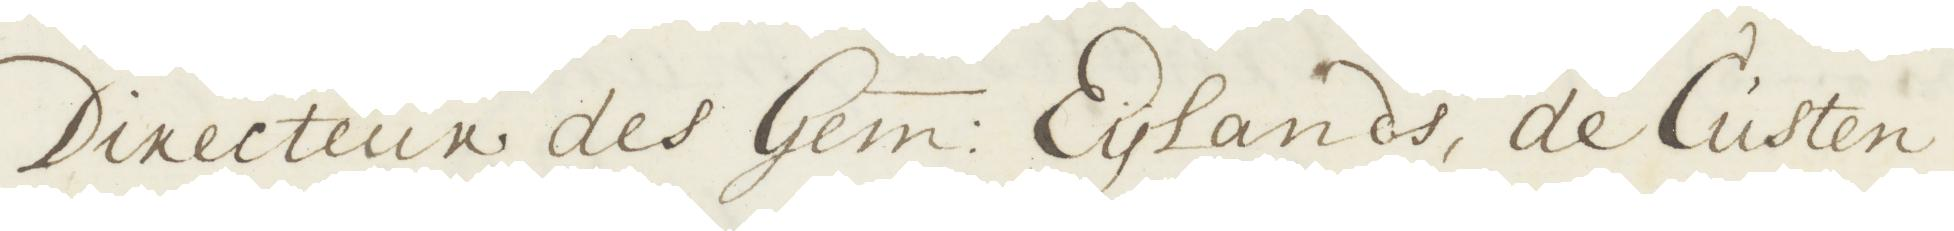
Directeur des Gem: Eijlands, de Custen
